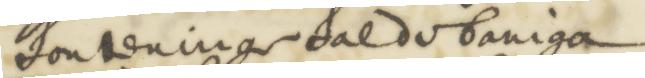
sorteringe sal de bariga
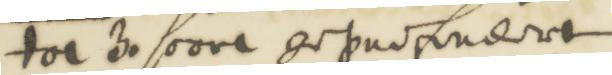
tot 3. soort gepreseveert
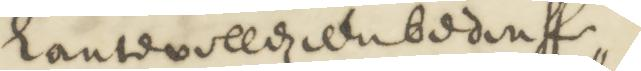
hartevellen een bederff„
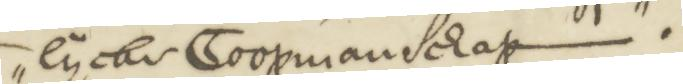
„lijcke Coopmanschap.
